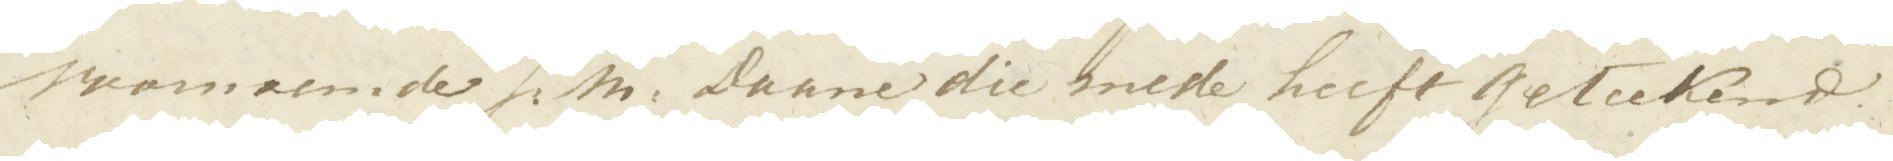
voornoemde J: M: Daane die mede heeft geteekend.
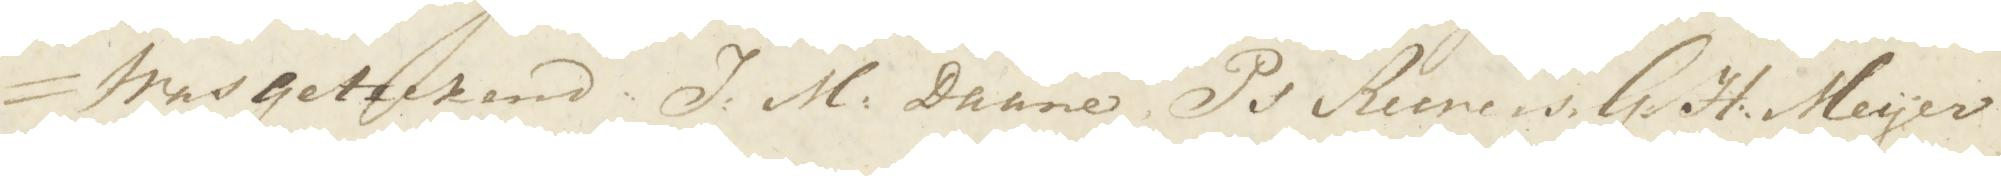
=Was geteekend. J: M: Daane, Ps Reevers, G: H: Meijer
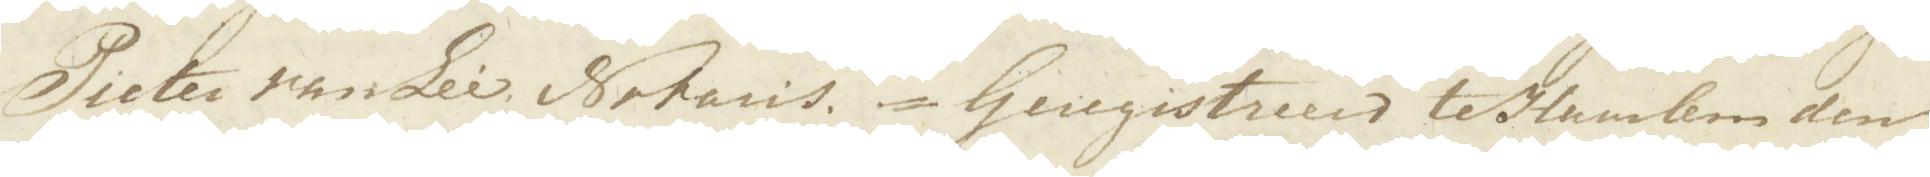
Pieter van Leé, Notaris. = Geregistreerd te Haarlem den
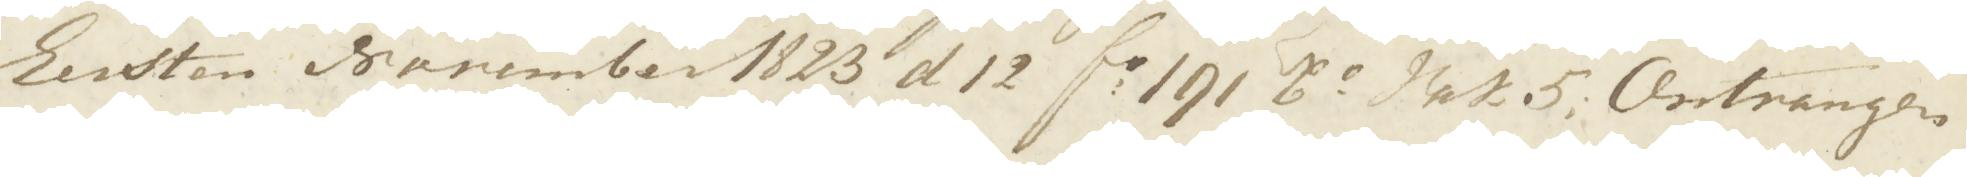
Eersten November 1823 d12 f:o 191 r.o Vak 5; Ontvangen
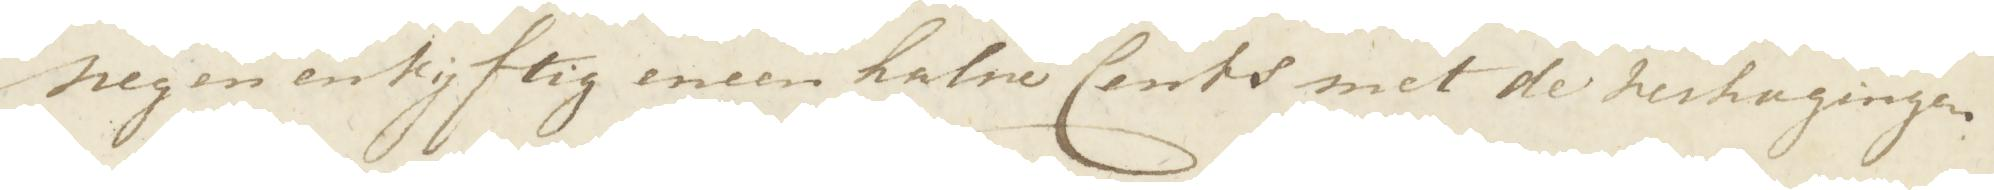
negen en vijftig en een halve Cents met de verhogingen
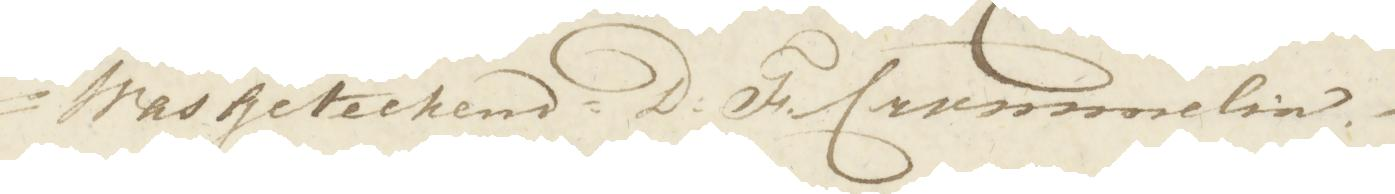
= Was geteekend = D: F. Crommelin.
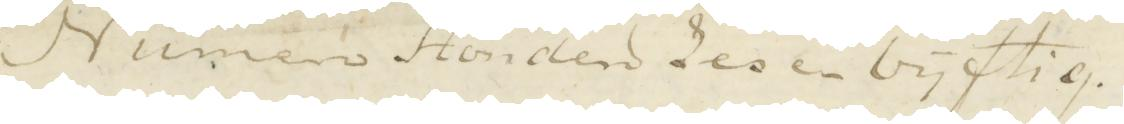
Numero Honderd Zes en Vijftig.
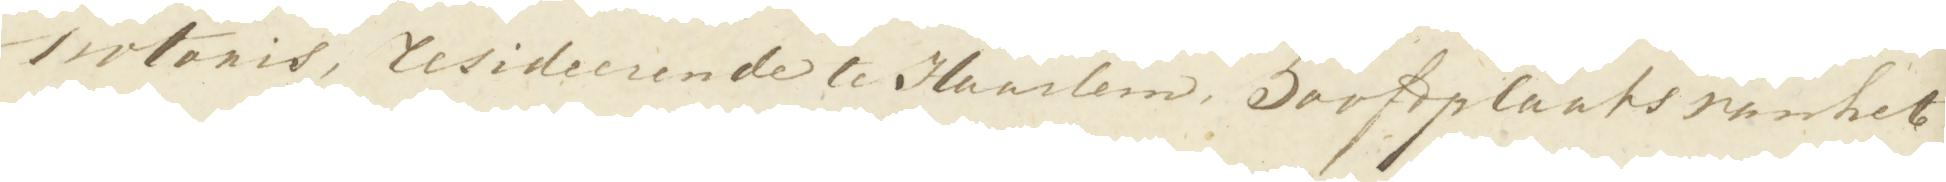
notaris, resideerende te Haarlem, hoofdplaats van het
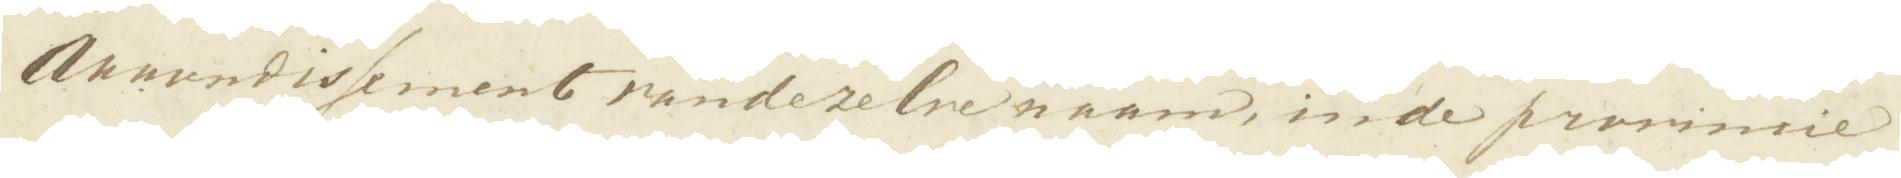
Arrondissement van dezelve naam, in de provinsie
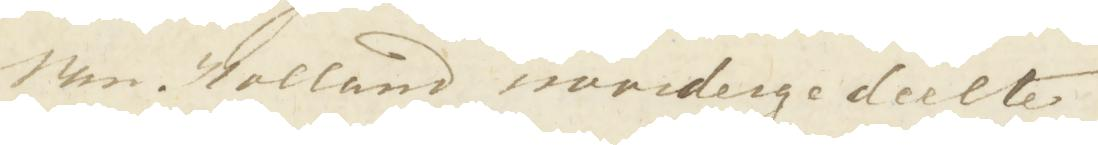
van Holland noordergedeelte
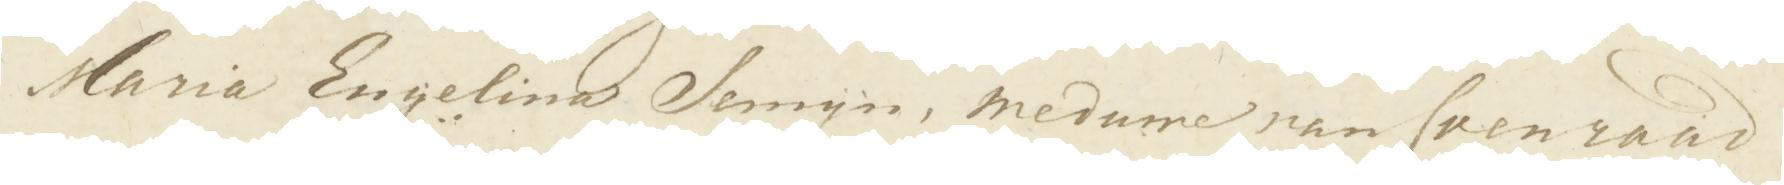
Maria Engelina Semijn, weduwe van Coenraad
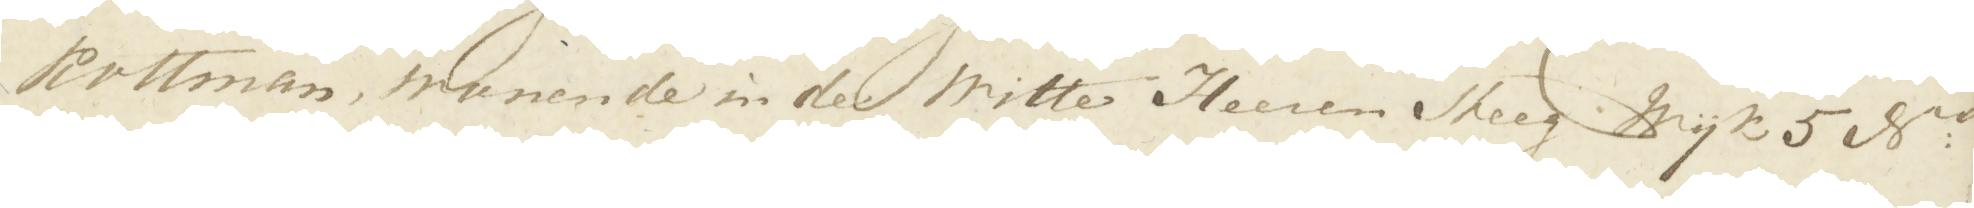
Kottman, wonende in de Witte Heeren Steen Wijk 5 N:o
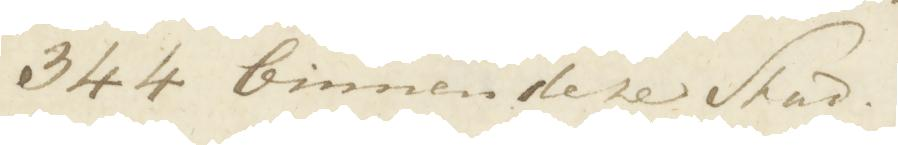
344 binnen deze Stad.
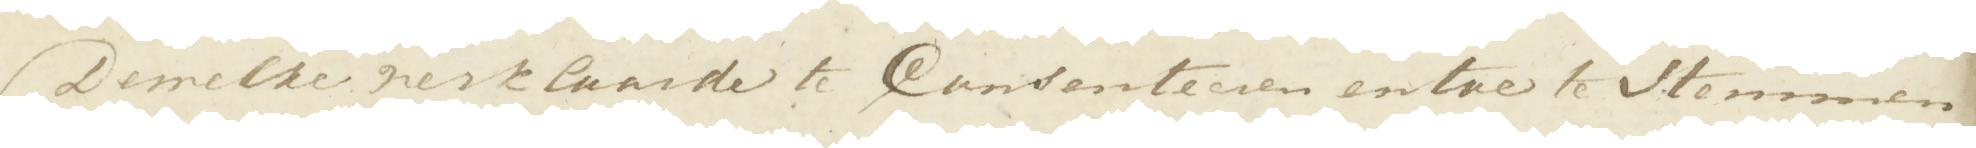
Dewelke verklaarde te Consenteeren en toe te stemmen
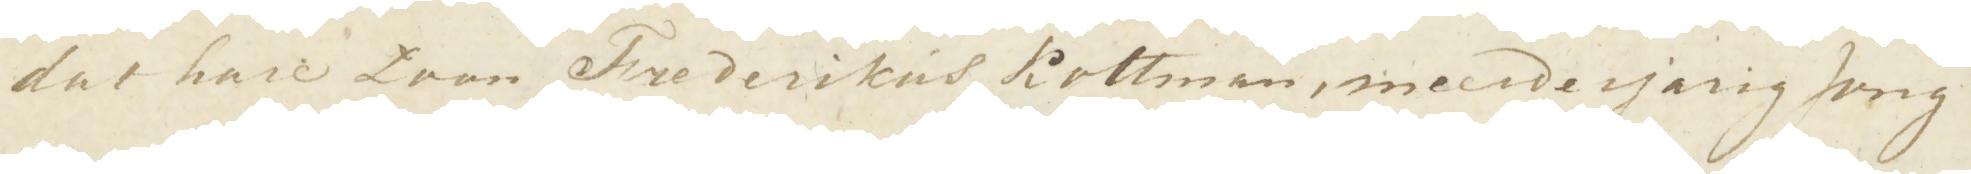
dat hare zoon Frederikus Kottman, meerderjarig Jong
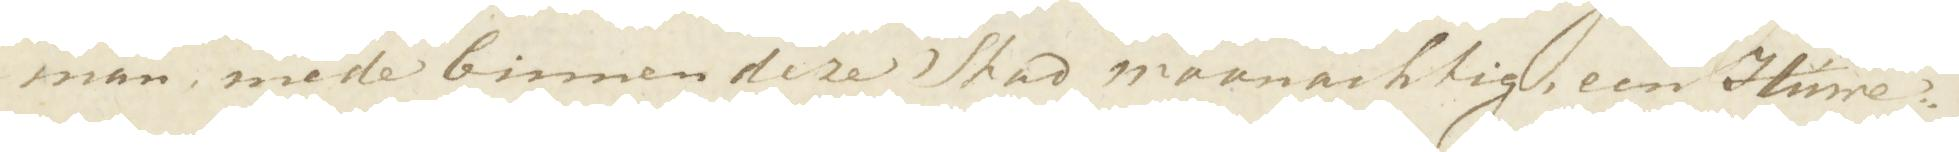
man, mede binnen deze Stad woonachtie, een Huwe„
